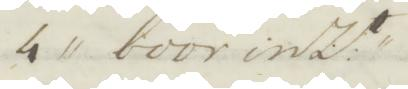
4„ boor inz:„t
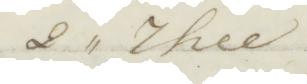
2 „ rhee
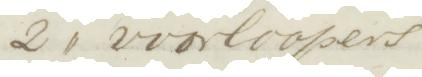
2 „ voorloopers
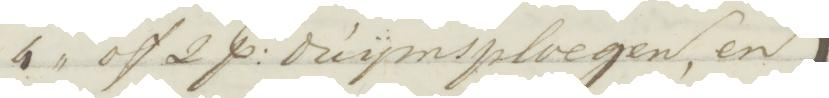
4 „ of 2 p:r duijmsploegen, en
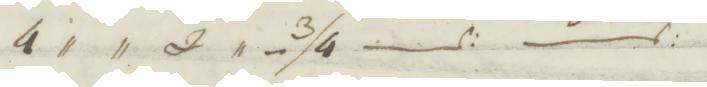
4 „ „ 2 „ -¾ _: _:
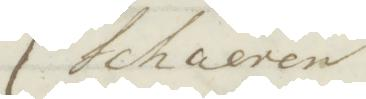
schaeven
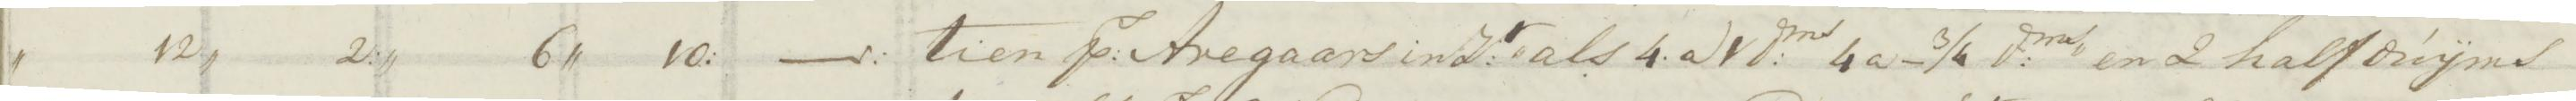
„ 12„ 2:„ 6„ 10: _: tien p:s Avegaars inz:t als 4. a 1 d:m 4a–¾ d:ms en 2 half duijms
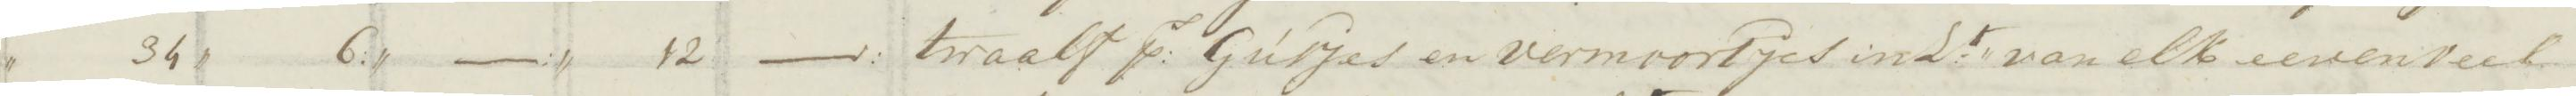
„ 34„ 6:„ —:„ 12: _: twaalf p:s Gusjes en vermoortjes inz:t van elk eevenveel
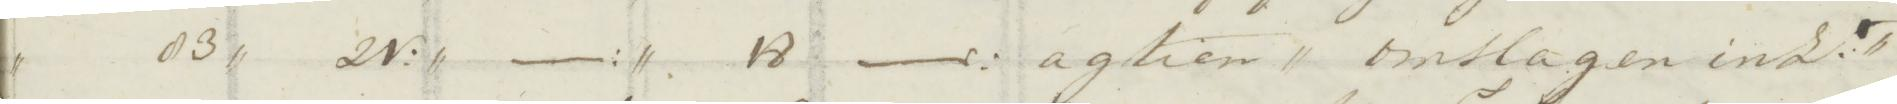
„ 83„ 21:„ —:„ 18 _: agtien „ omslagen inz:„t
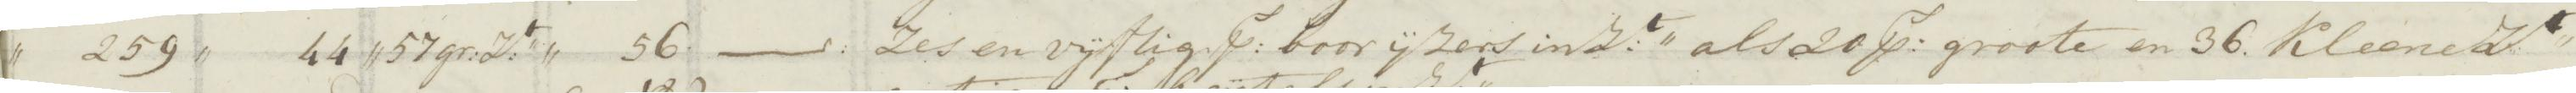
„ 259 „ 44„ 57 gr: z:t „ 56: _: zes en vijftig, p:s boorijzers in z:t„ als 20 p:s groote en 36. kleene z„t
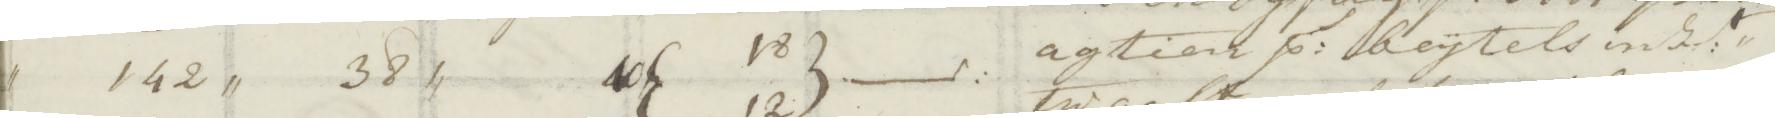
„ 142„ 38„ 40 18 _: agtien p:s beijtels in inz:„t
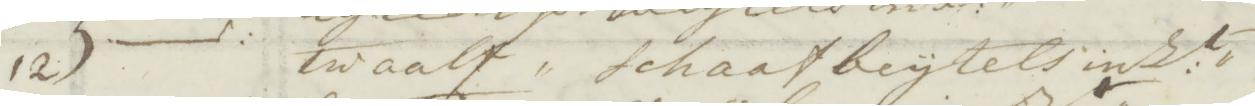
12 twaalf „ schaafbeijtels inz:„t
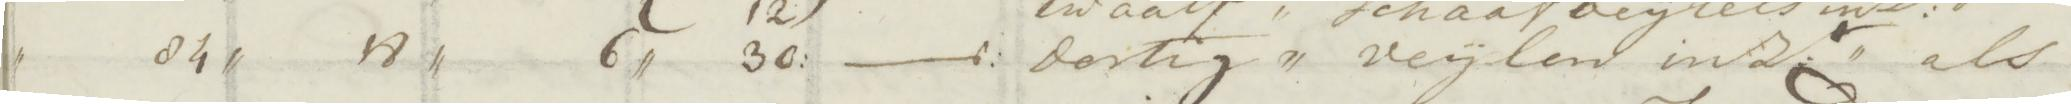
„ 84„ 18„ 6„ 30: _: dertig „ veijlen inz:„t als
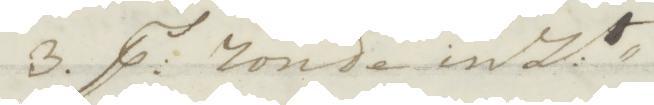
3. p:s ronde inz:„t
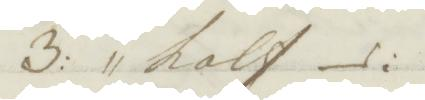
3: „ half _:
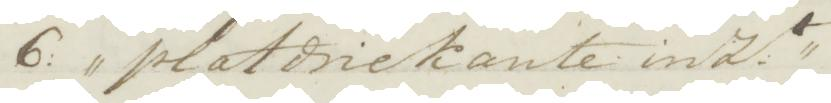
6: „ platdriekante inz:„t
